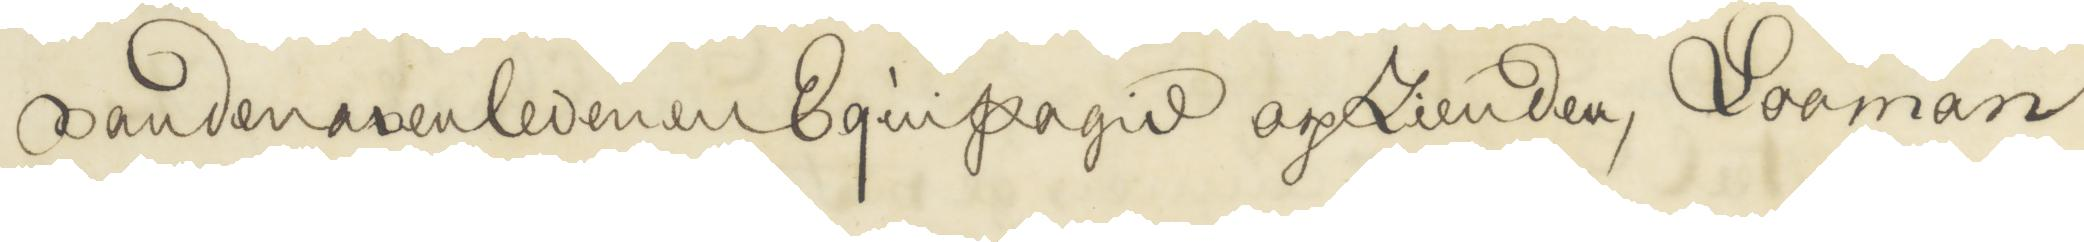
van den overledenen Equipagie opziender, Looman
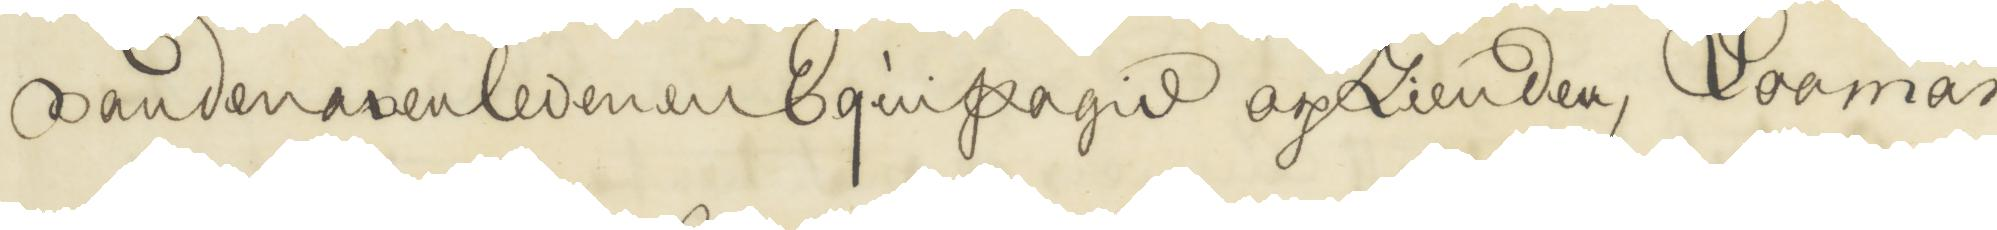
geweest zijnde Effecten, opgenomen, en aan den
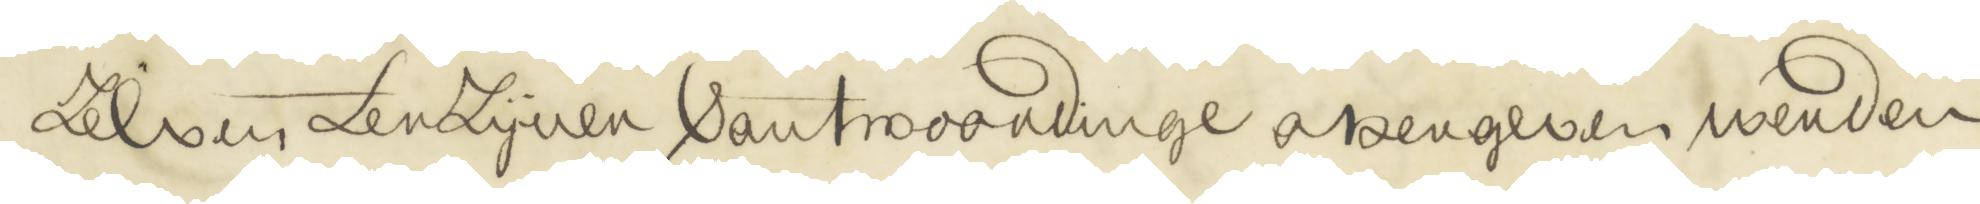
zelven ter zijner verantwoordinge overgeven werden
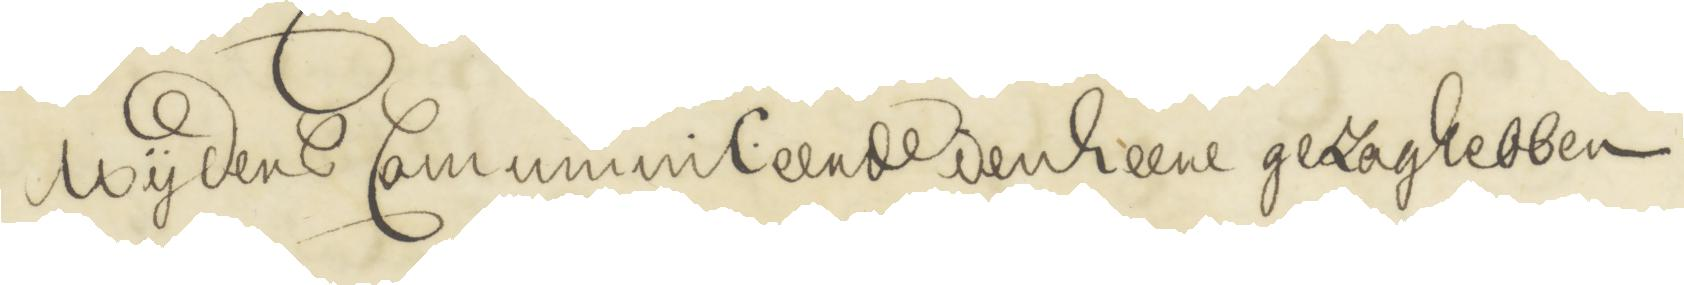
wijders communiceerde den heere gezaghebber
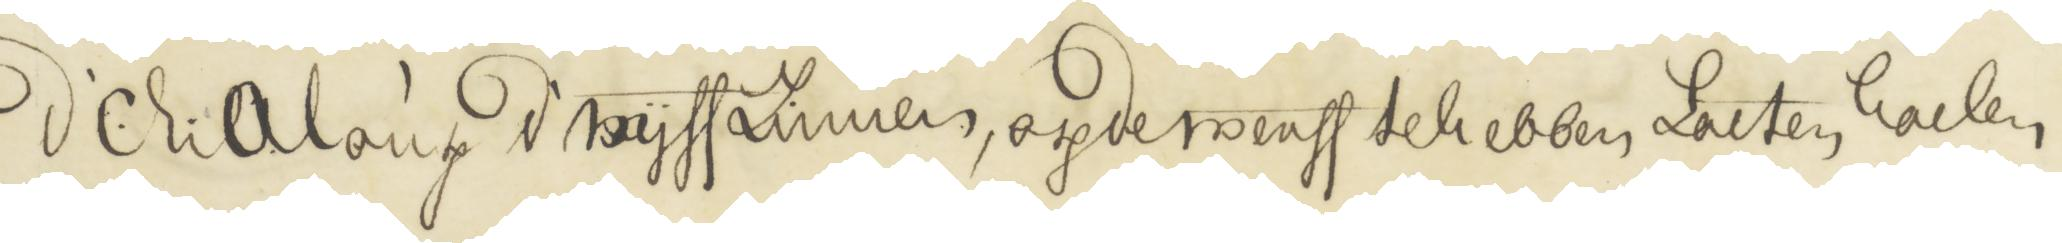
d'Chialoup d'vijffzinnen, op de werff te hebben laeten haelen
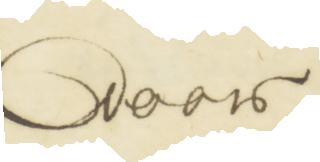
daar;
